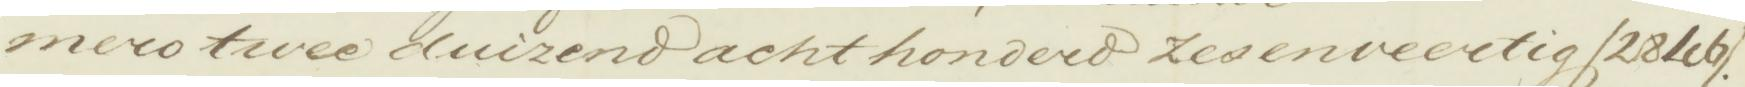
mero twee duizend acht honderd zes en veertig /2846/.
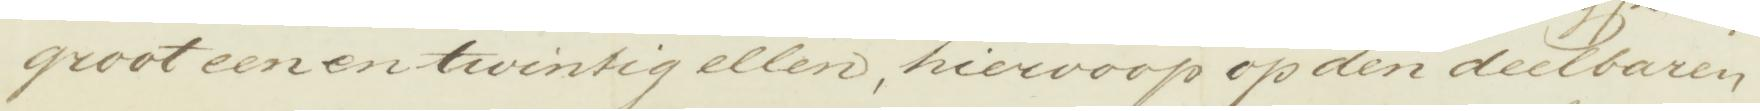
groot een en twintig ellen, hiervoop op den deelbaren
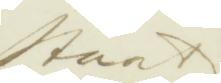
staat
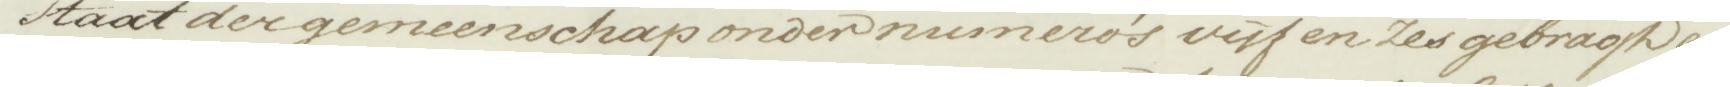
staat der gemeenschap onder numero's vijf en zes gebragt en
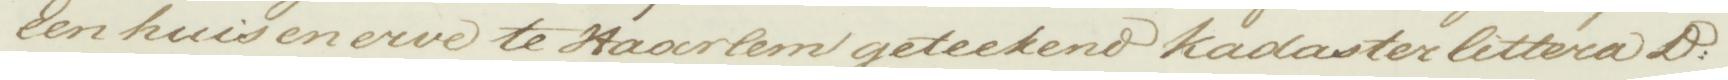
Een huis en erve te Haarlem geteekend kadaster littera D:
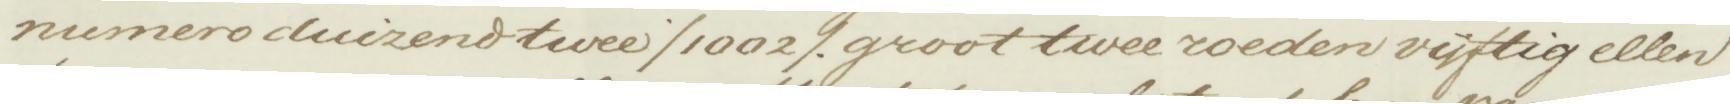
numero duizend twee '/1002/. groot twee roeden vijftig ellen
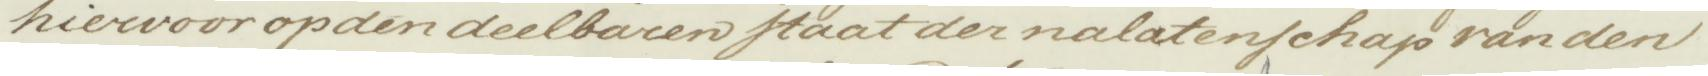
hiervoor op den deelbaren staat der nalatenschap van den
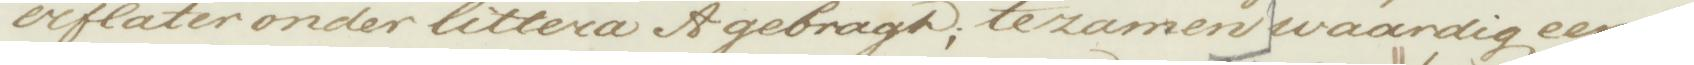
erflater onder littera A gebragt; tezamen | waardig eene
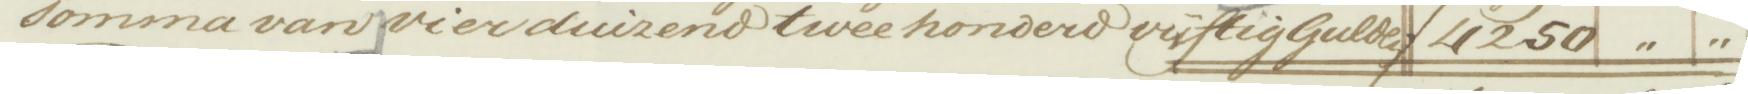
somma van | vier duizend twee honderd vijftig Gulden ƒ 4250 „ „
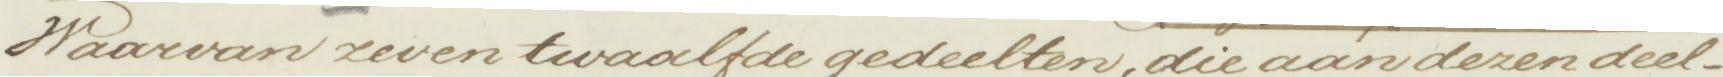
Waarvan zeven twaalfde gedeelten, die aan dezen deel-
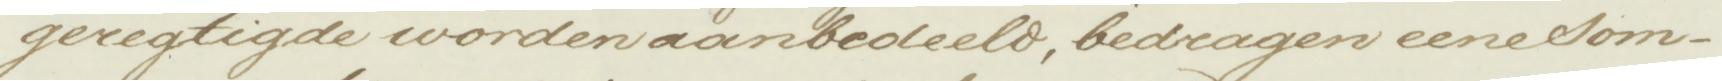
geregtigde worden aanbedeeld, bedragen eene som-
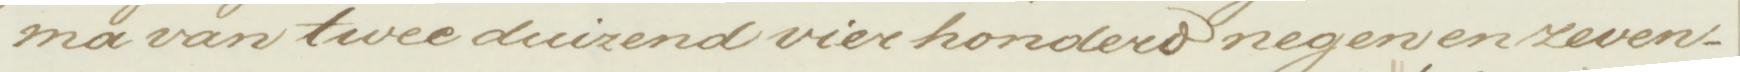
ma van twee duizend vier honderd negen en zeven-
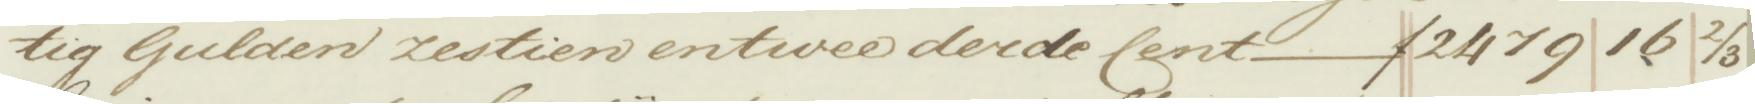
tig Gulden zestien en twee derde Cent ƒ2479 16 2/3
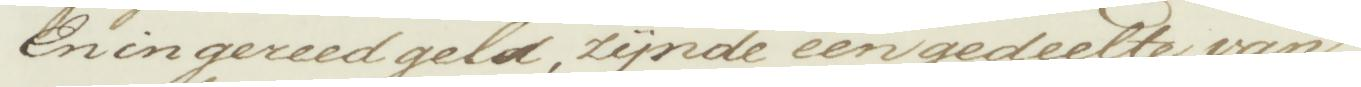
En in gereed geld, zijnde een gedeelte van
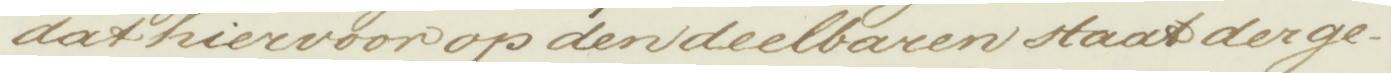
dat hiervoor op den deelbaren staat der ge-
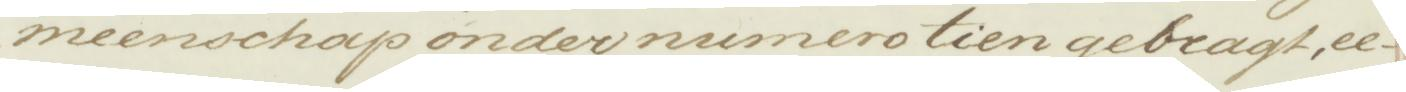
meenschap onder numero tien gebragt, ee-
